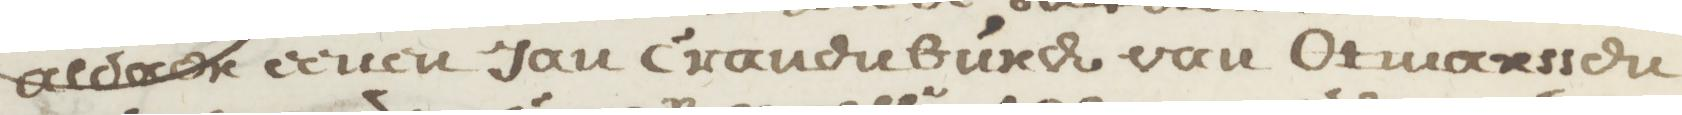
aldaer eenen Ian Cranenburch van Otmarssen
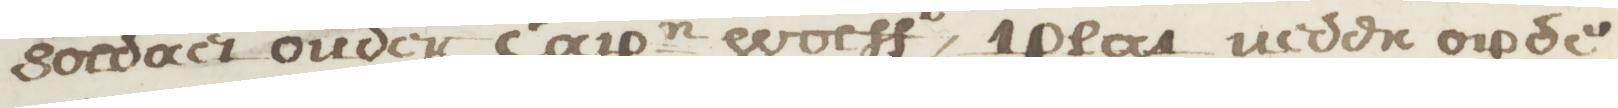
soldaet onder cap=n wolff, plat neder op de
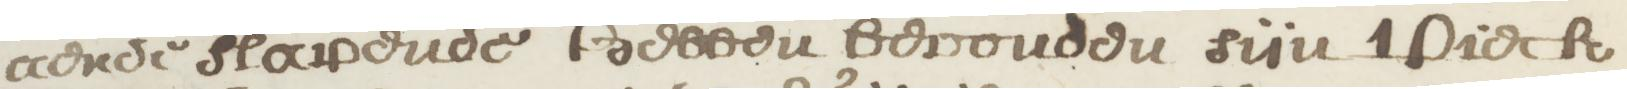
aerde slapende hebben bevonden sijn pieck
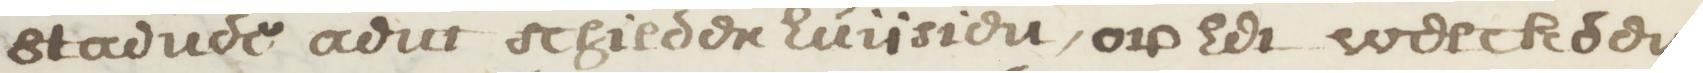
staende aent schilder huijsien, op het welck den
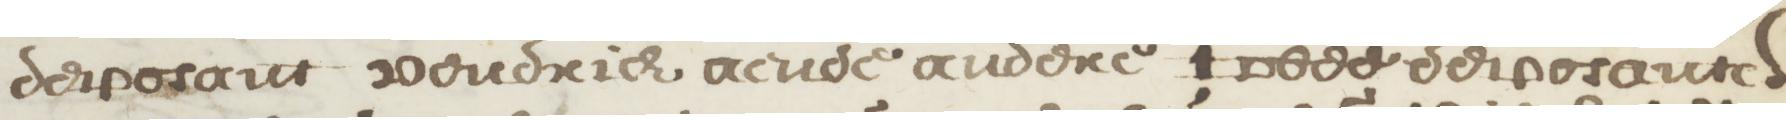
deposant vendrich aende twee deposanten
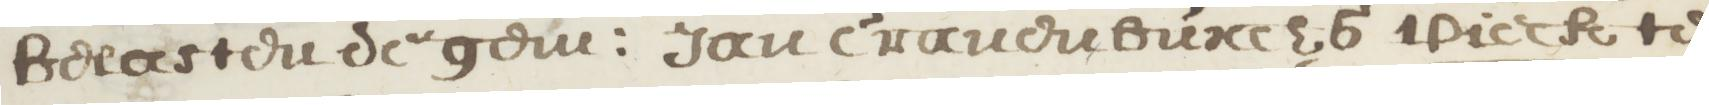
belasten de gem: Ian Cranenburchs pieck te
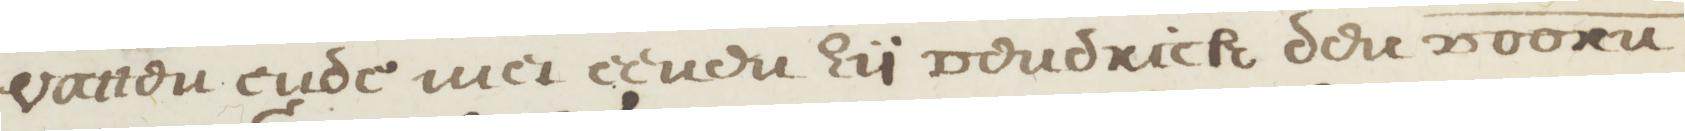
vatten ende met eenen hij vendrich den voorn
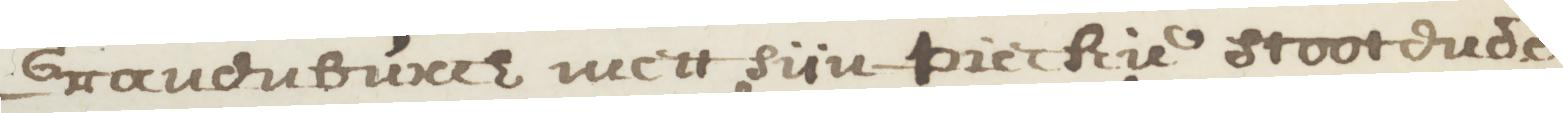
Cranenburch mett sijn pieckie stootende
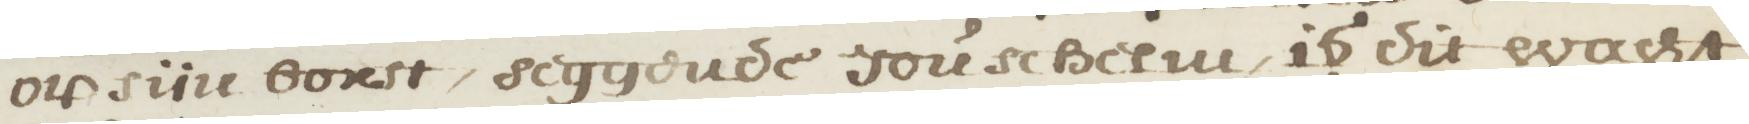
op sijn borst, seggende Iouschelm, is dit wacht
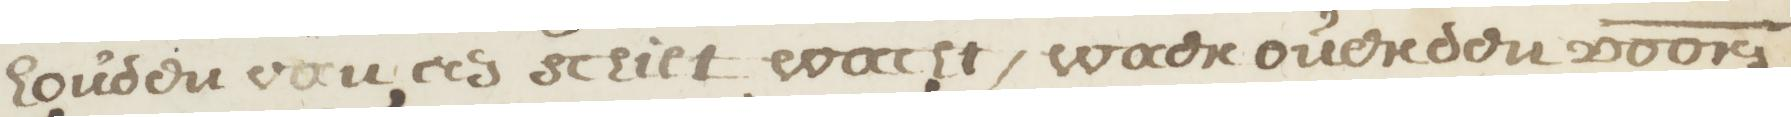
houden van een shilt wacht, waer over den voorn
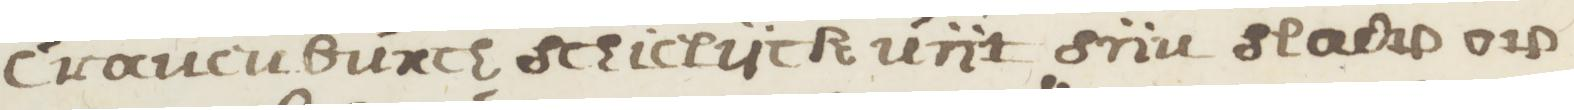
Cranenburch schielijck uijt sijn slaep op
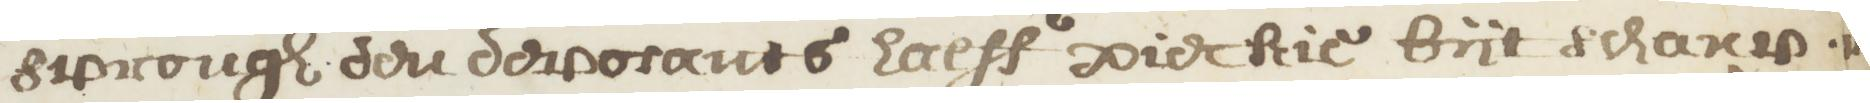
sprongh den deposants half pieckie bijt scharp
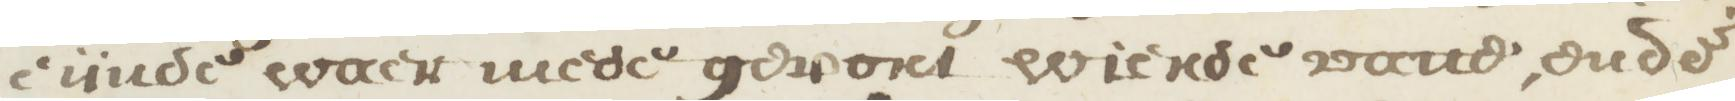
eijnde waer mede geport wierde vand, ende
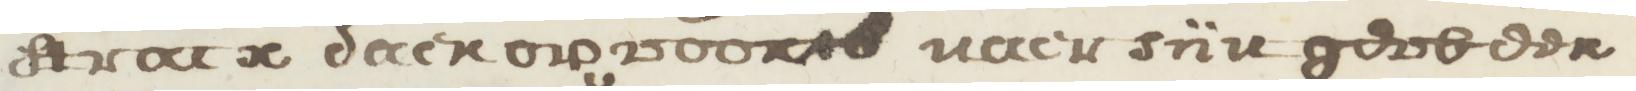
stracx daer op voorts naer sijn geweer
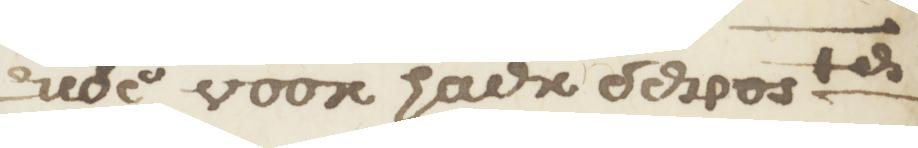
gesprongen heeft, Ende voor haer depos=ten
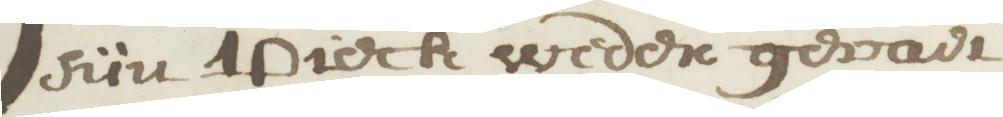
sijn pieck weder gevaet ende gecregen,
